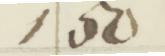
1 50
